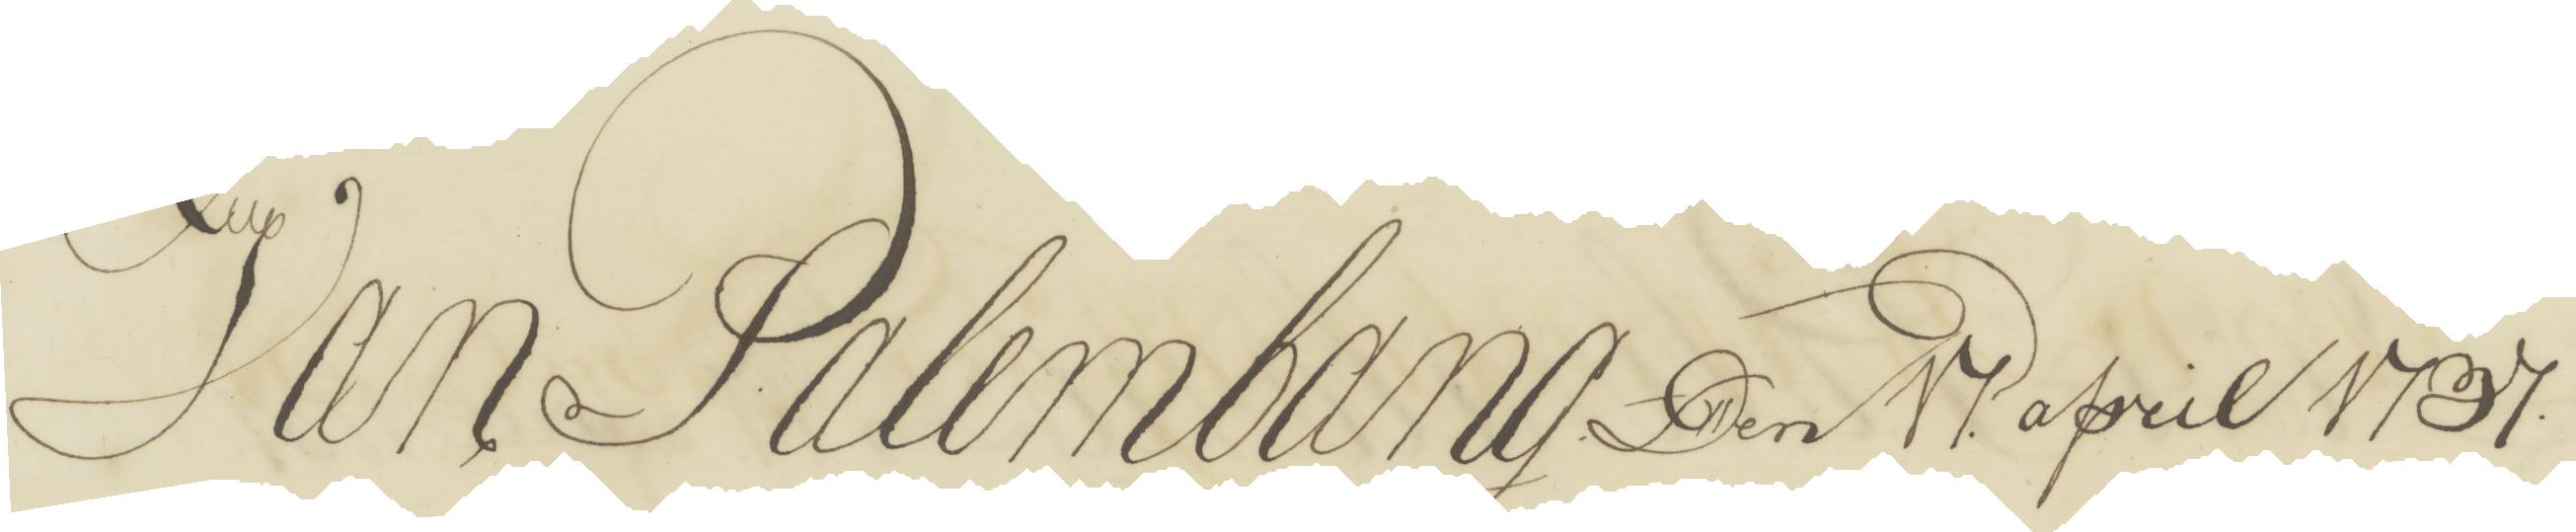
Van Palembang Den 17. april 1737.
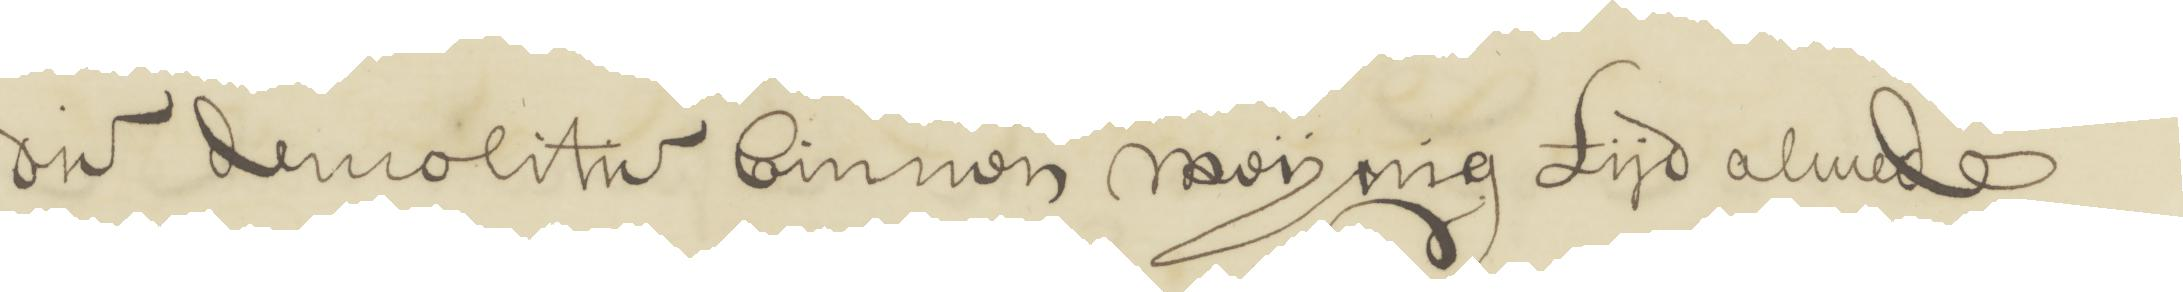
die demolitie binnen weijnig tijd almede
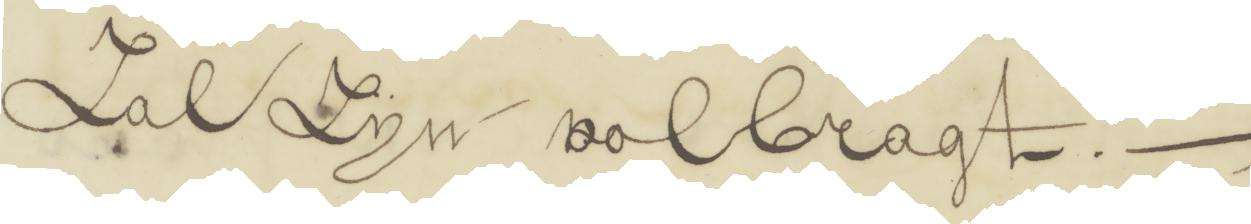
zal zijn volbragt. —
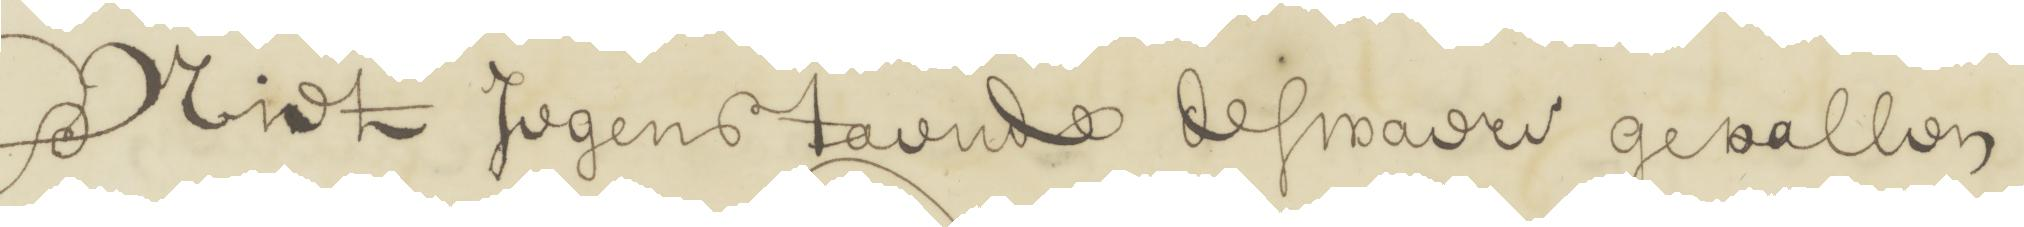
Niet Jegenstaende deswaere gevallen
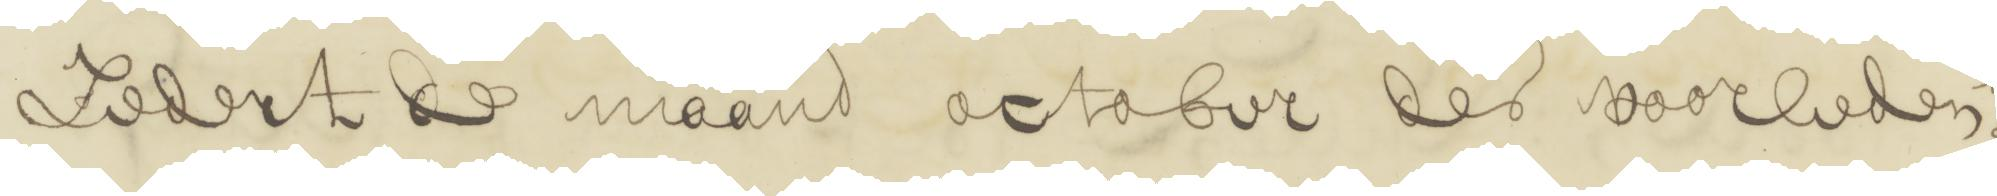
zedert de maand october des voorleden
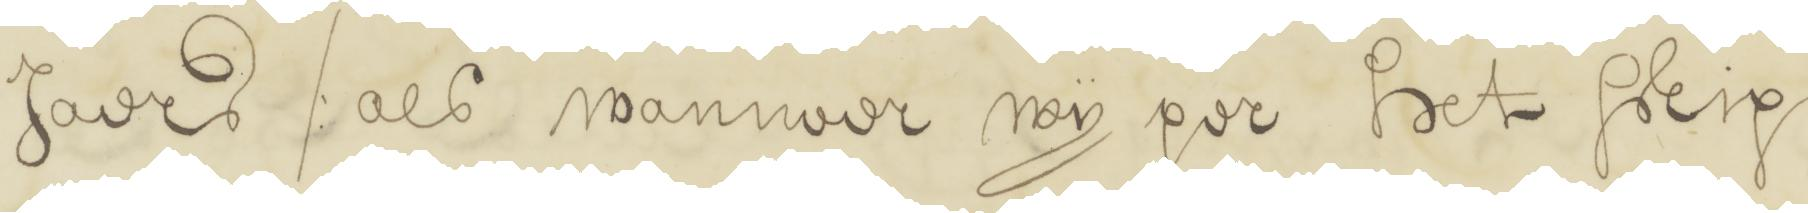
Jaers /:als wanneer wij per het schip
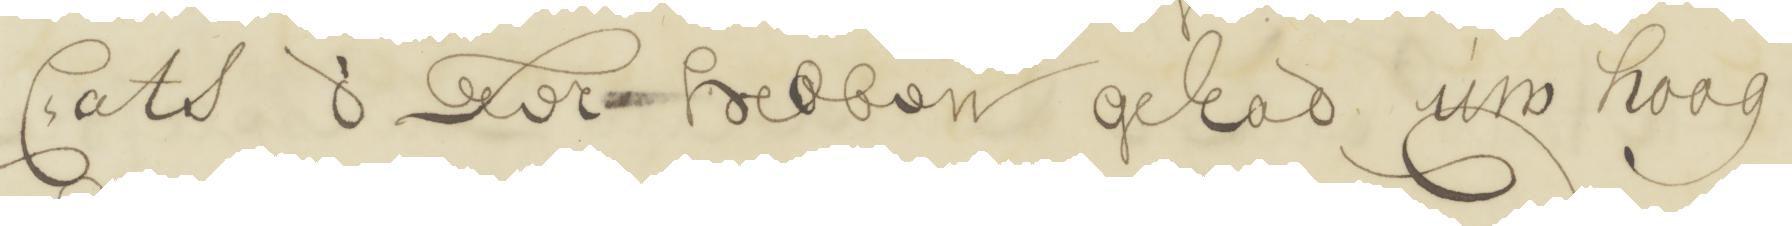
Cats d'Eer hebben gehad uw hoog
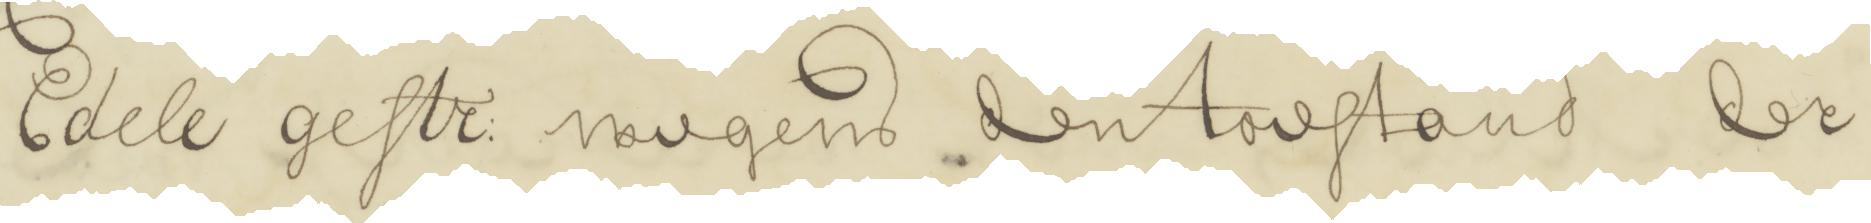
Edele gestr: wegens dentoestand der
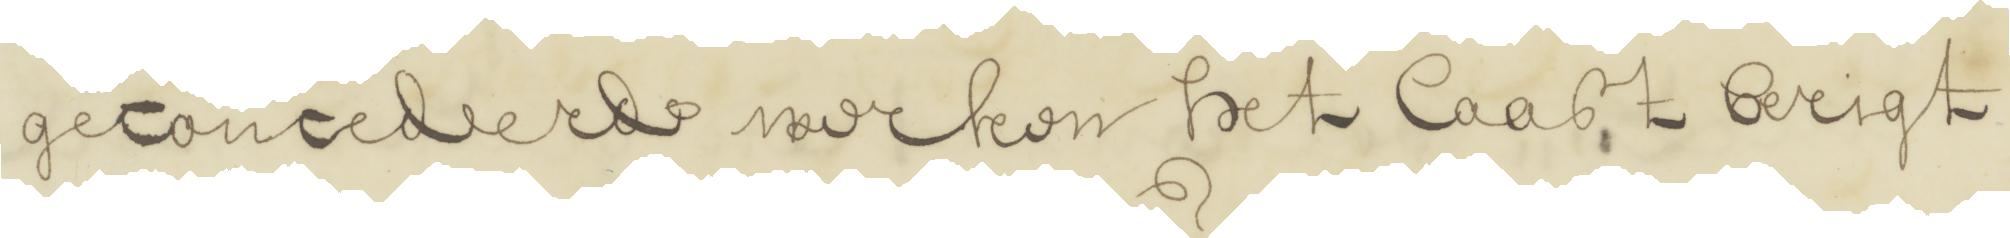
geconcedeerde werken het laast berigt
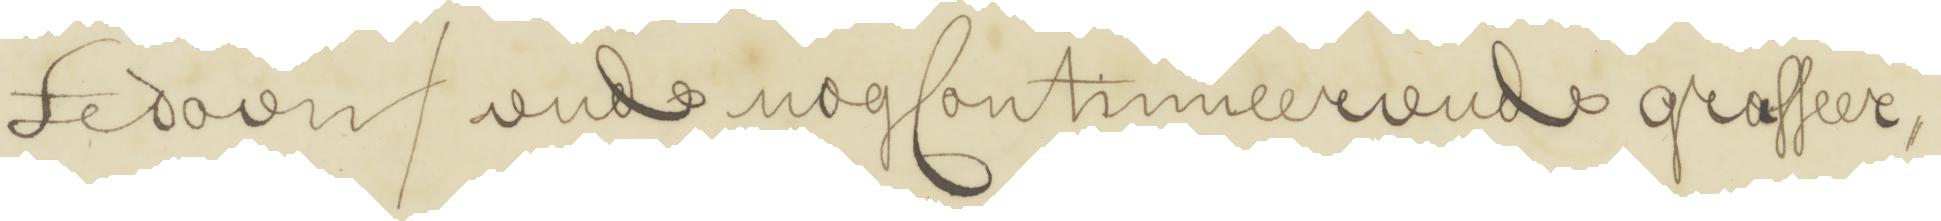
tedoen / ende nog Continueerende grasseer„
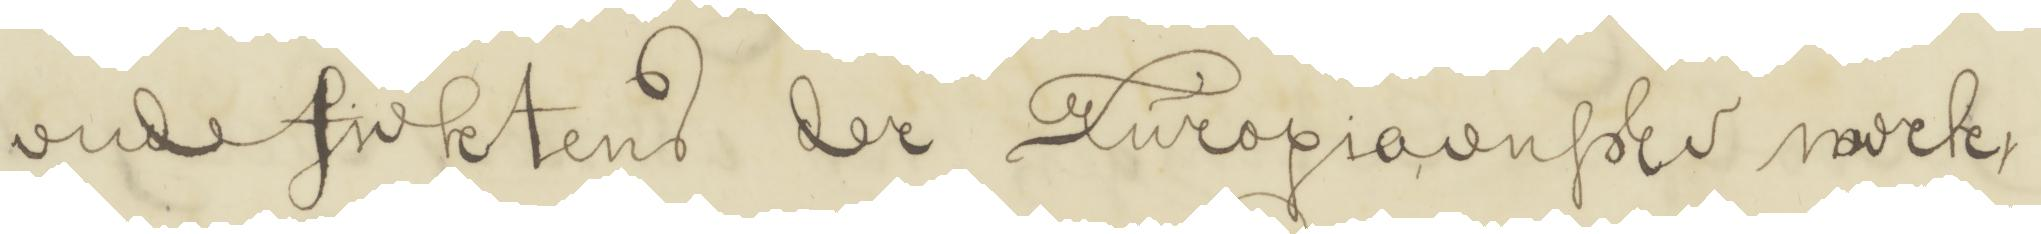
ende fiektens der Europiaensche werk„
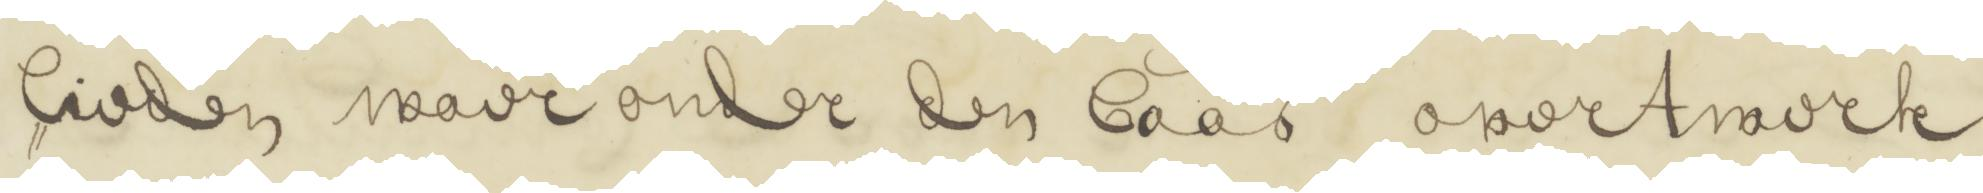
„lieden waer onder den baas overtwerk
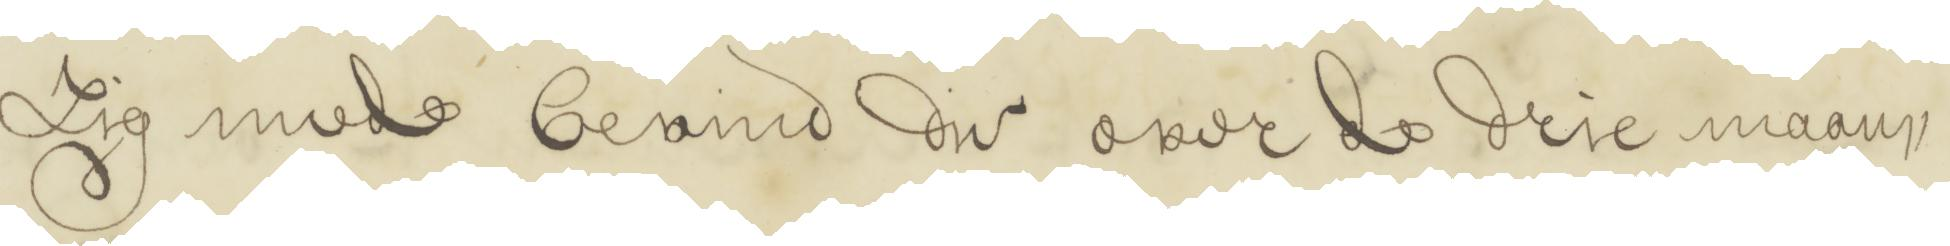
zig mede bevind die over de drie maan„
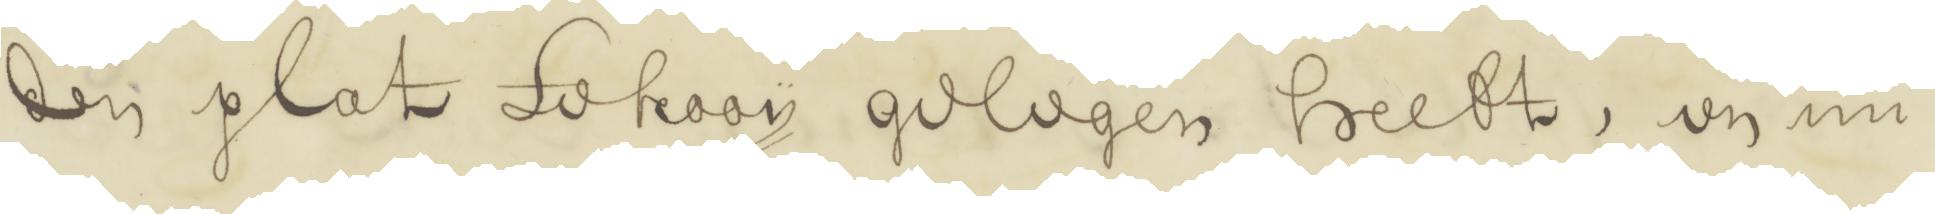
den plat tekooij gelegen heeft, en nu
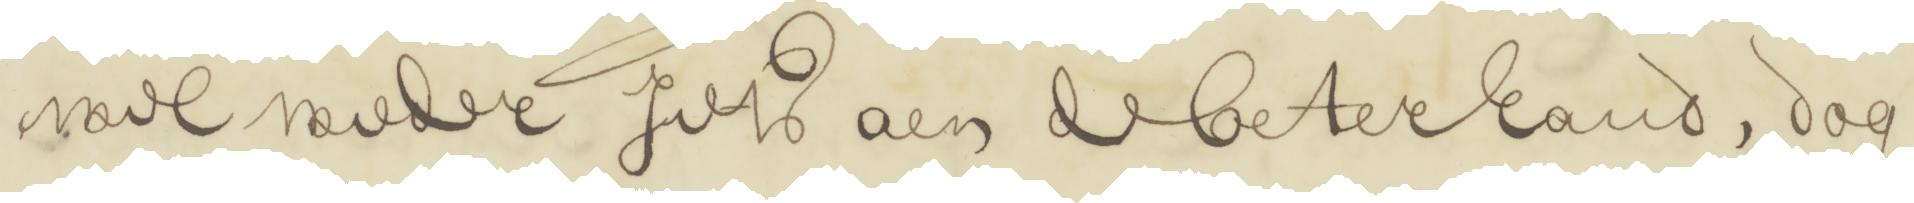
wel weder Jets aen debeterhand, dog
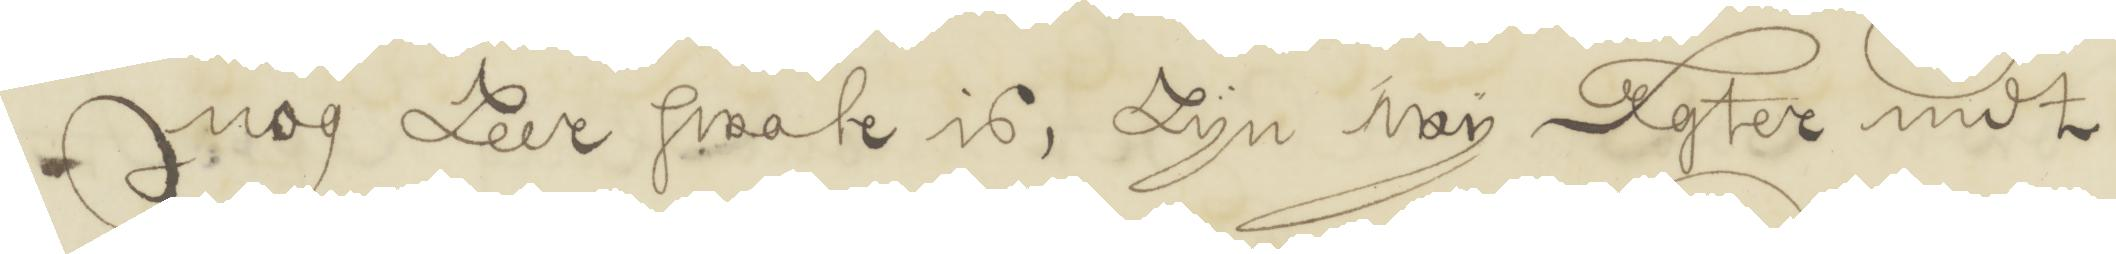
nog zeer swak is, zijn wij Egter met
